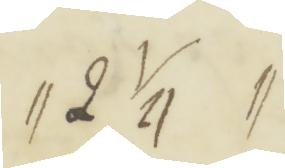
„ 2¼ „
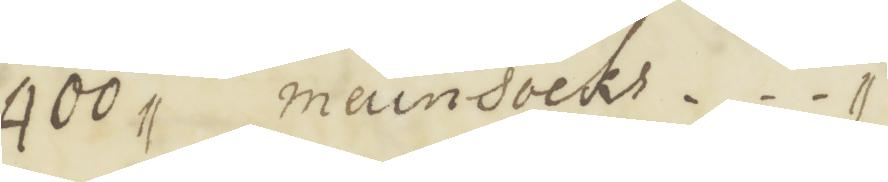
400 „ mainsoeks - - - „
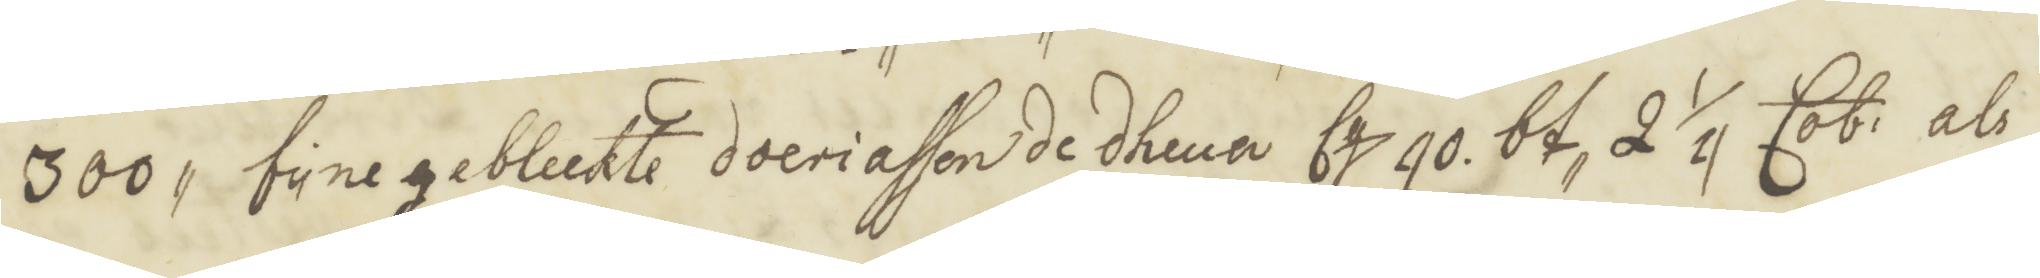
300 „ fijne gebleekte doeriassen de dhena bt„ 40. bt„ 2¼ Cob: als
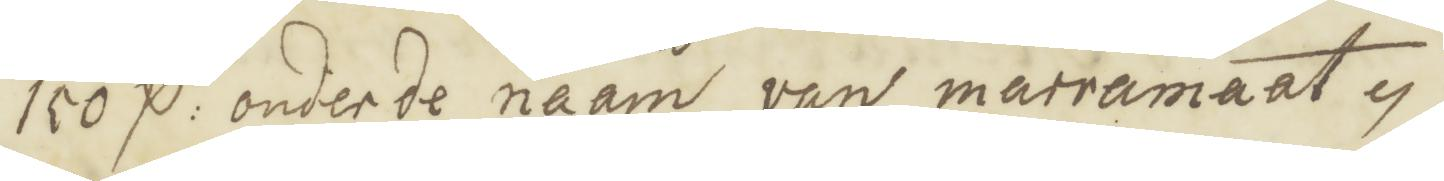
150 p:s onder de naam van matramaat en
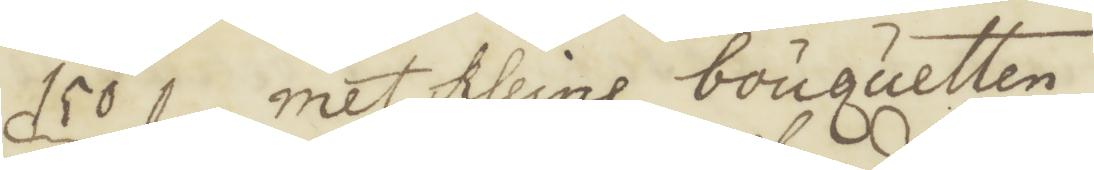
150 „ met kleine bouquetten
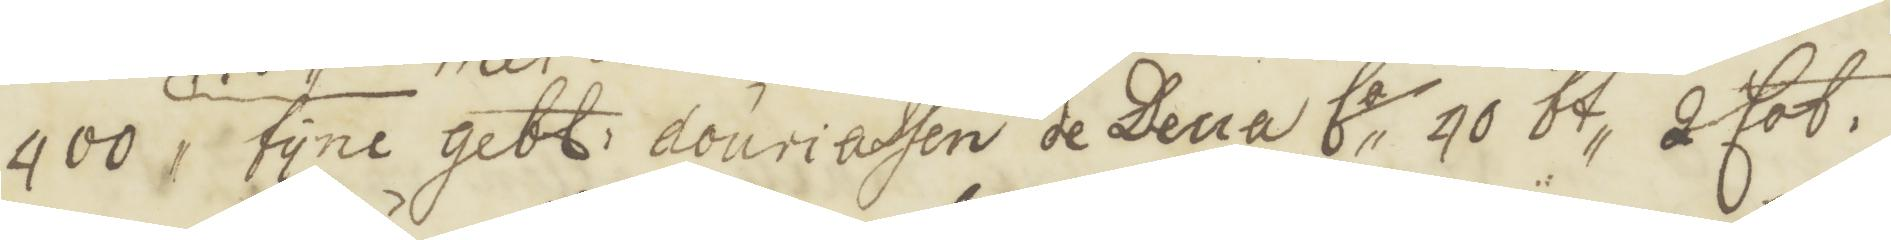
400 „ fijne gebl: douriassen de Dena C„b/ 40 bb„ 2 Cob.
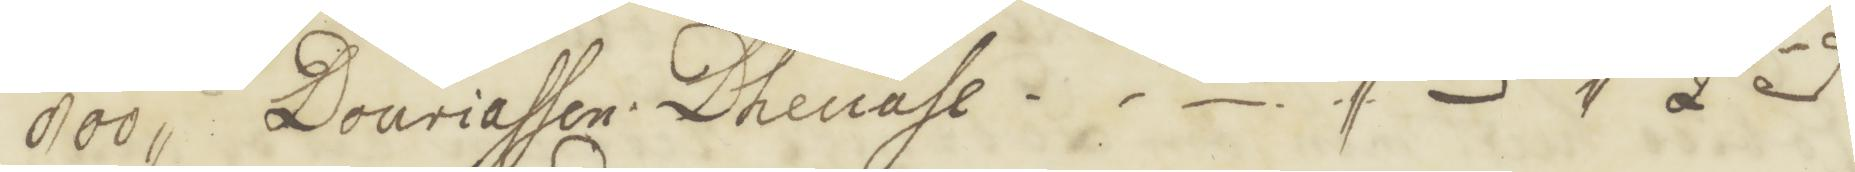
800 „ Douriassen Dhenase - - — - -„- _o „ 2 _o
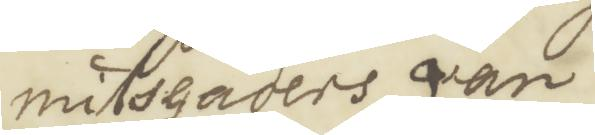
mitsgaders van
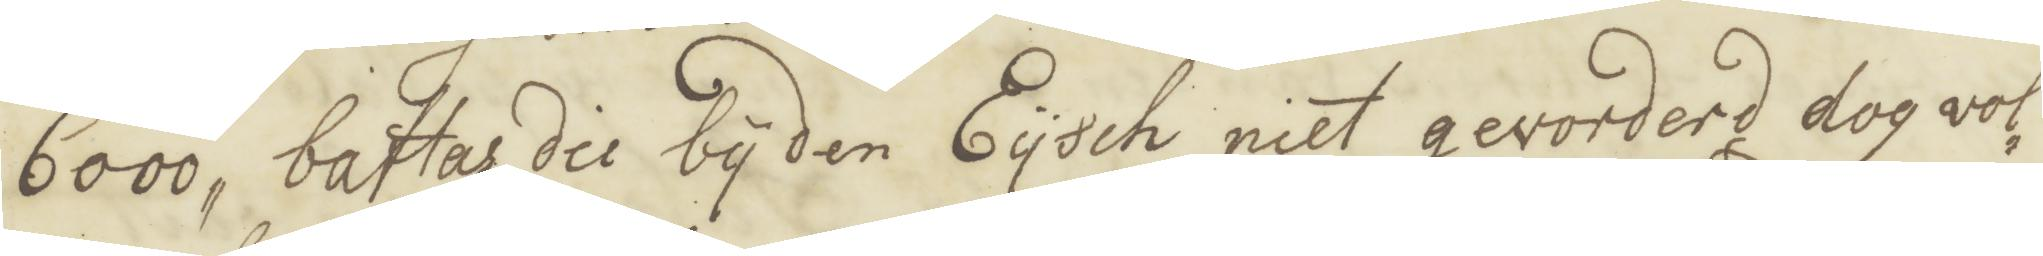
6000„ battas die bij den Eijsch niet gevorderd doo vol=
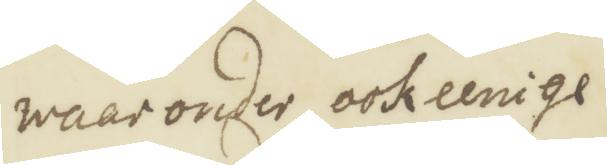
waar onder ook eenige
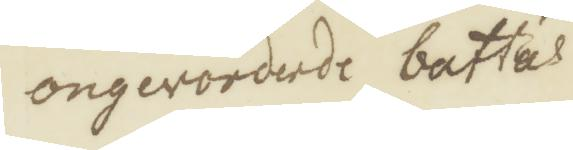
ongevorderde battas
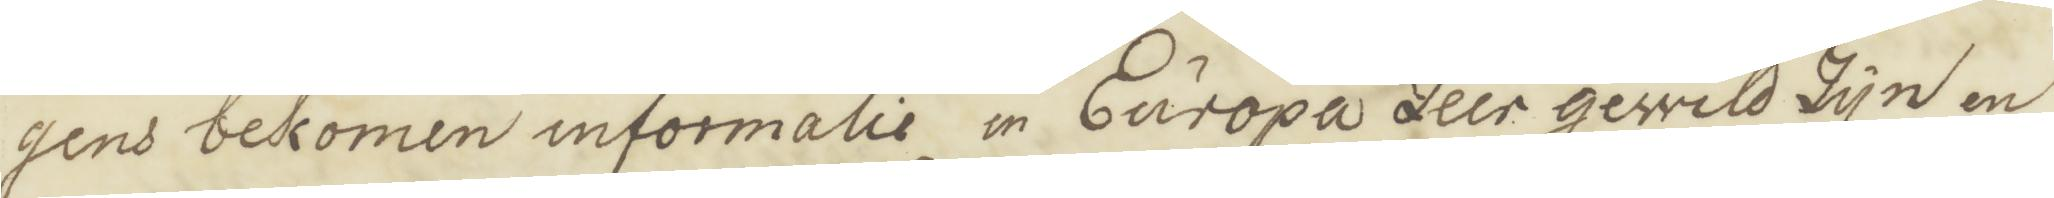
gens bekomen informatie in Europa zeer gewild zijn en
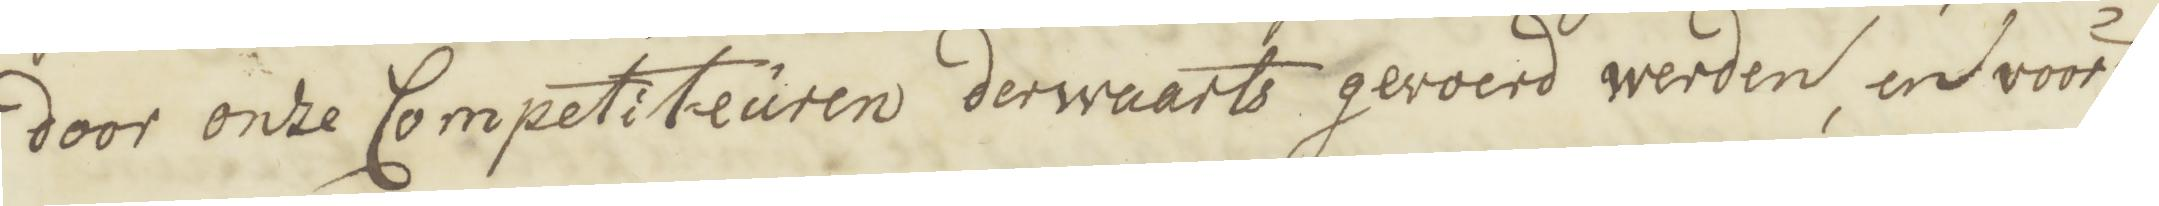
door onze Competiteuren derwaarts gevoerd werden, en voor't
